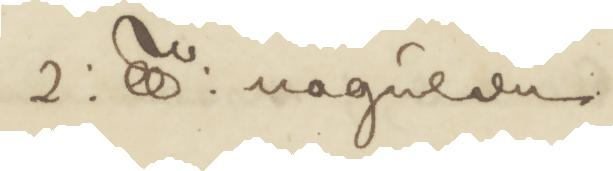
2: lb: nagulen
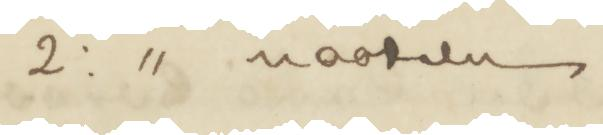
2: „ nooten
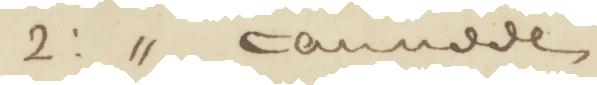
2: „ canneel
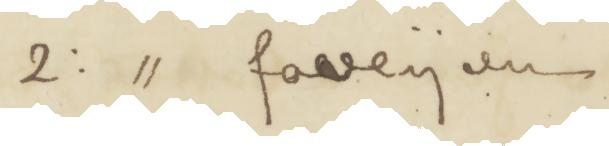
2: „ foelij en
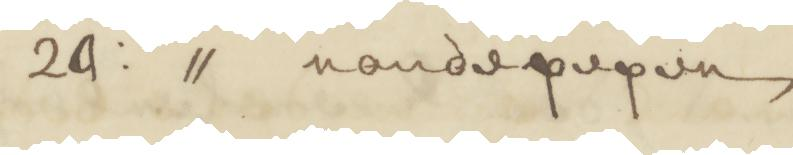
24: „ ronde peper
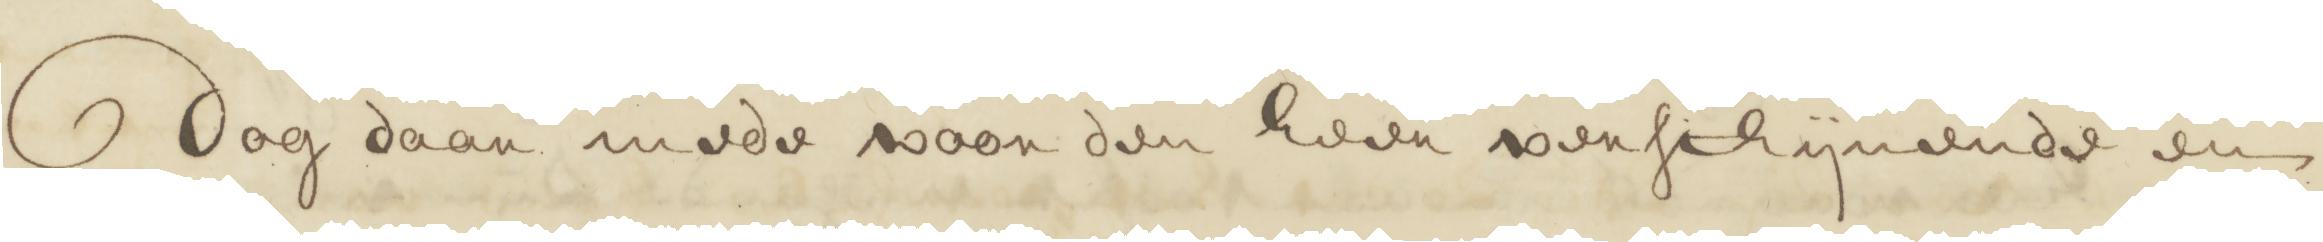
Dog daar mede voor den heer verschijnende en
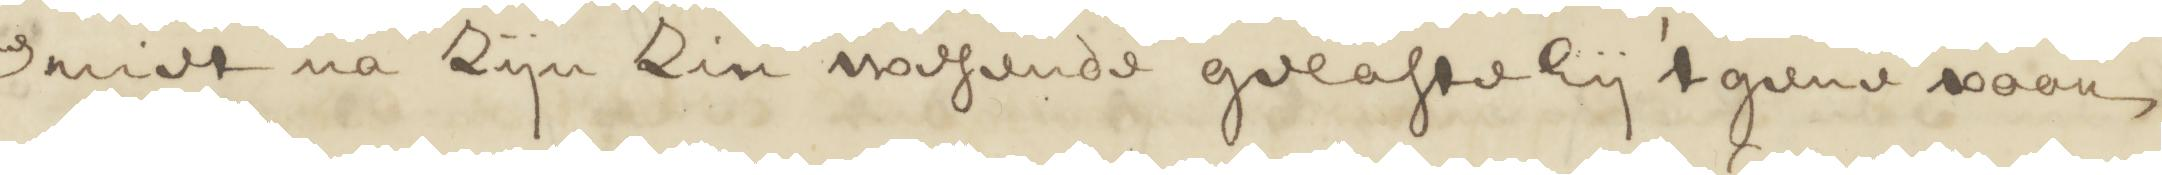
niet na zijn zin wesende gelaste hij ’t gene voor
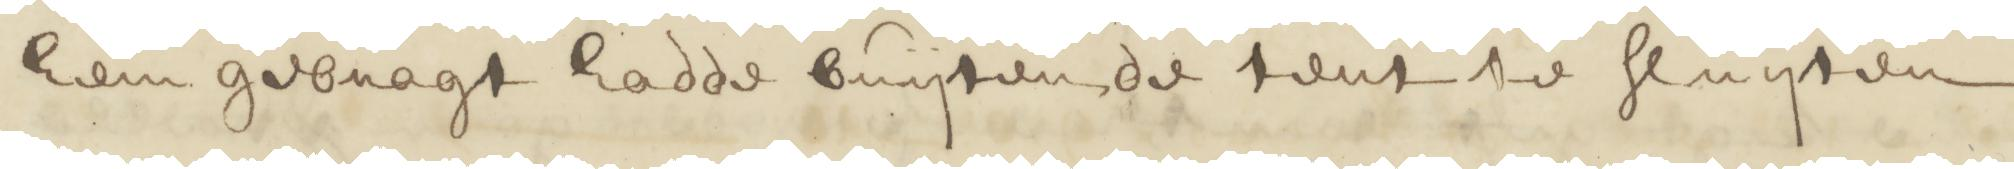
hem gebragt hadde buijten de tent te sluijten
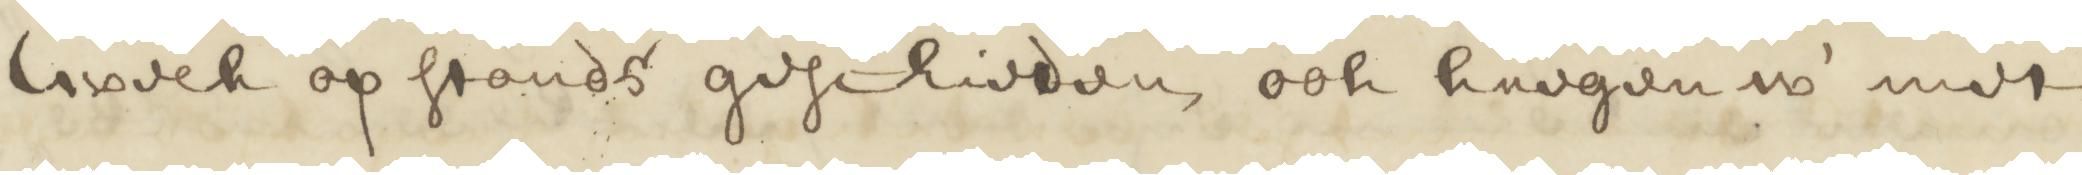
twelk op stonds geschieden ook kregen w' met
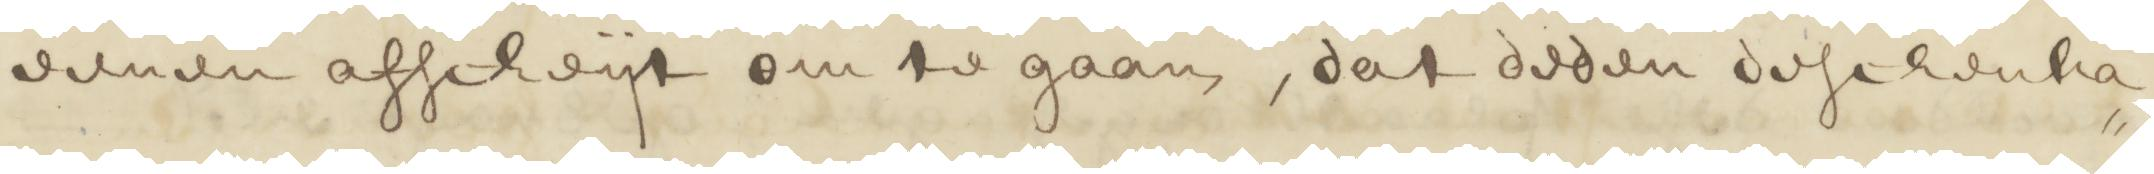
eenen afscheijt om te gaan, dat deden deschenka„
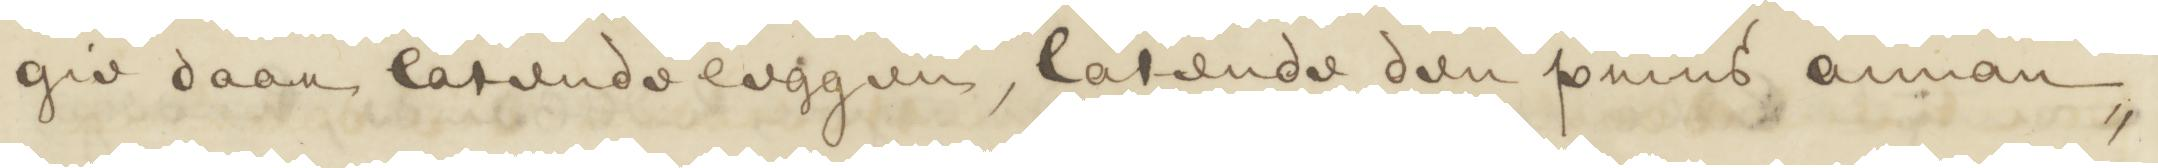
gie daar latende leggen, latende den prins annan„
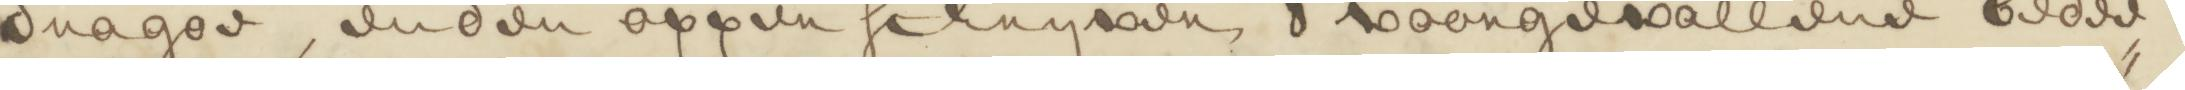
dragoe, en den opper schrijver 't voorgevallene bedee„
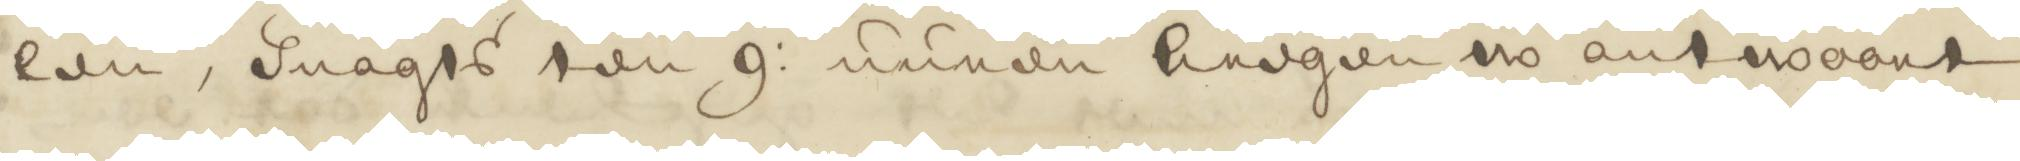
len, snagts ten 9: uuren kregen w' antwoort
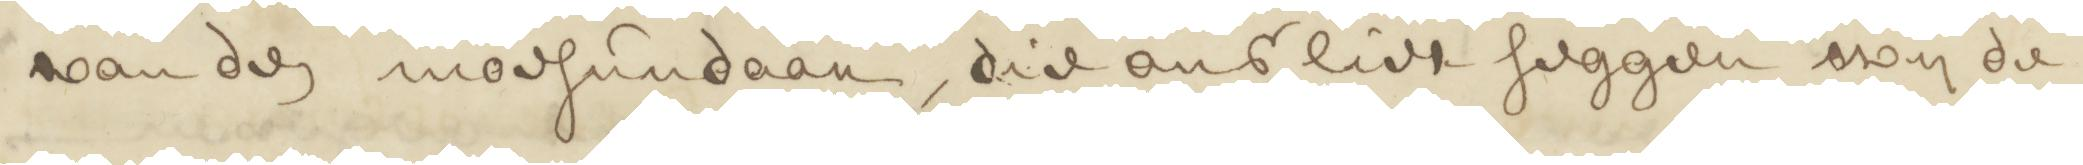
van den moesundaar, die ons liet seggen wij de
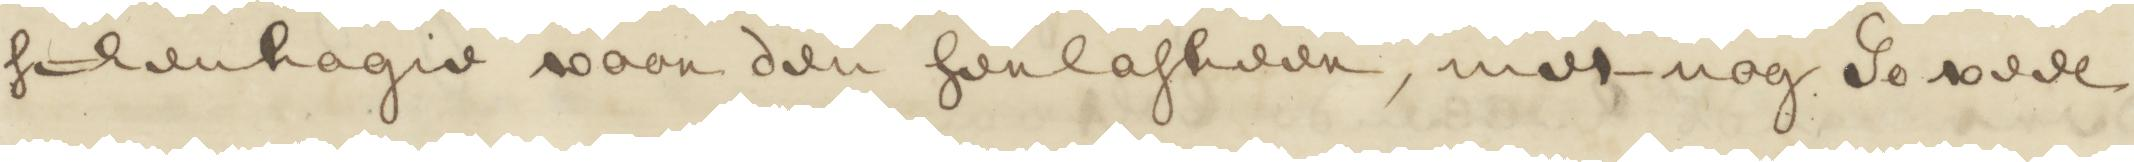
schenkagie voor den serlaskeer, met nog so veel
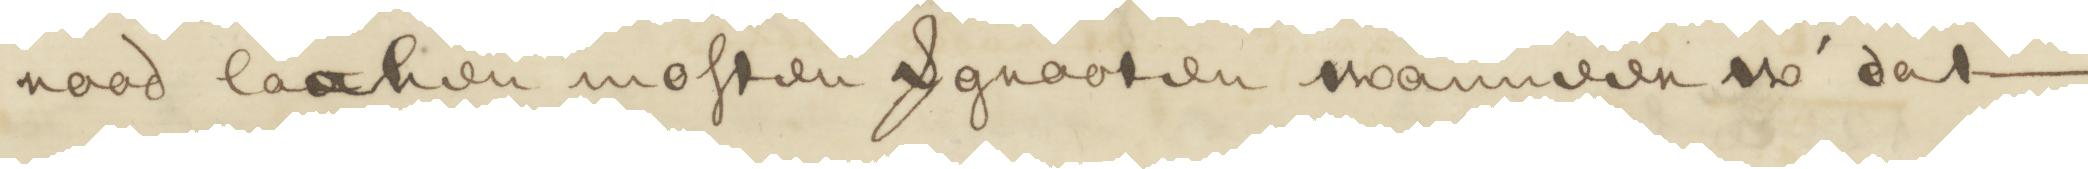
rood laaken mosten vergrooten wanneer w' dat
